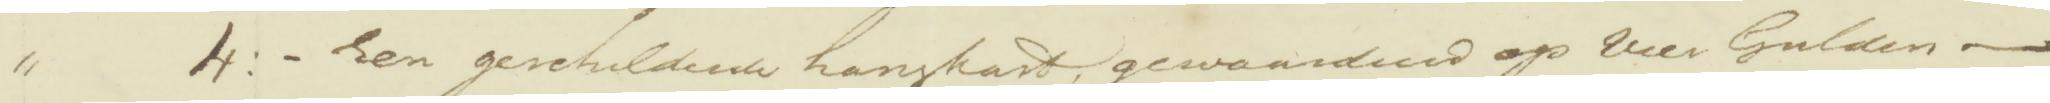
„ 4: - Een geschilderde hangkast, gewaardeerd op vier Gulden —
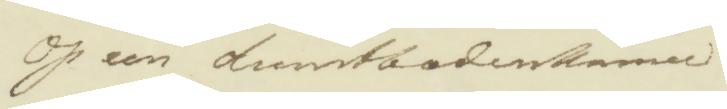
Op een dienstbodenkamer
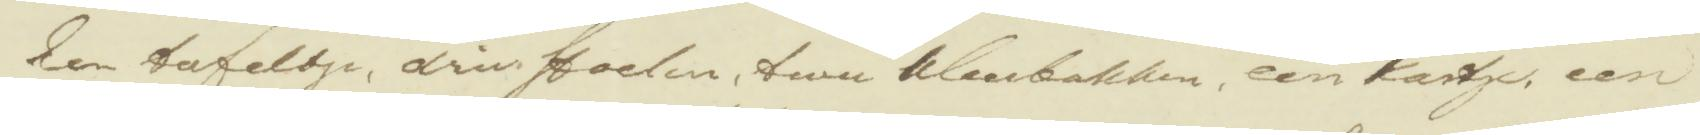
Een tafeltje, drie stoelen, twee kleerbakken, een kastje, een
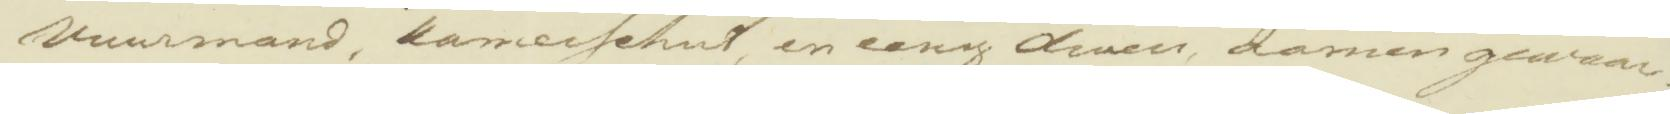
vuurmand, kamerschut, en eenig divers, zamen gewaar
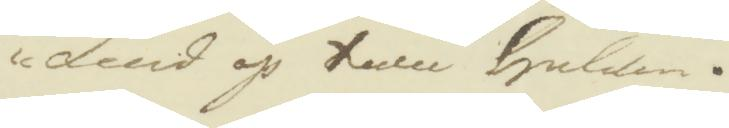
„deerd op twee Gulden.
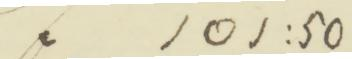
f 101:50
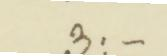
3: -
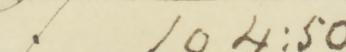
f 104:50
